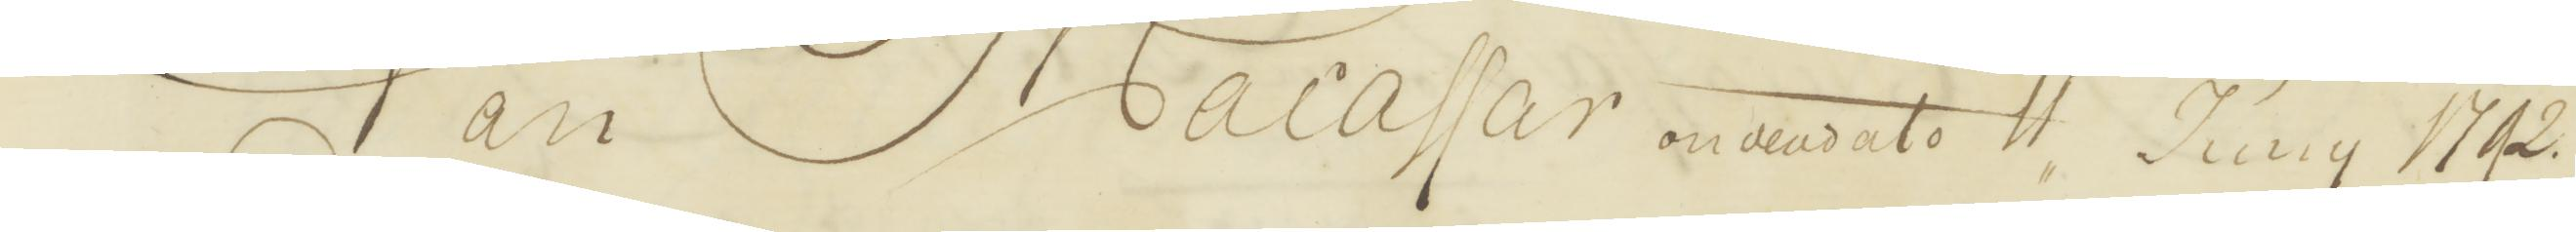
Van Macassar onderdato 11„' Iunij 1742.
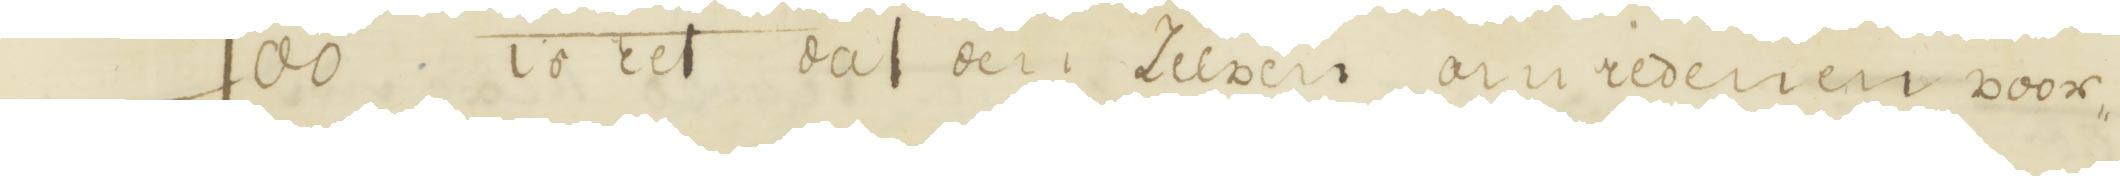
Soo. is het dat den zelven omredenen voor„
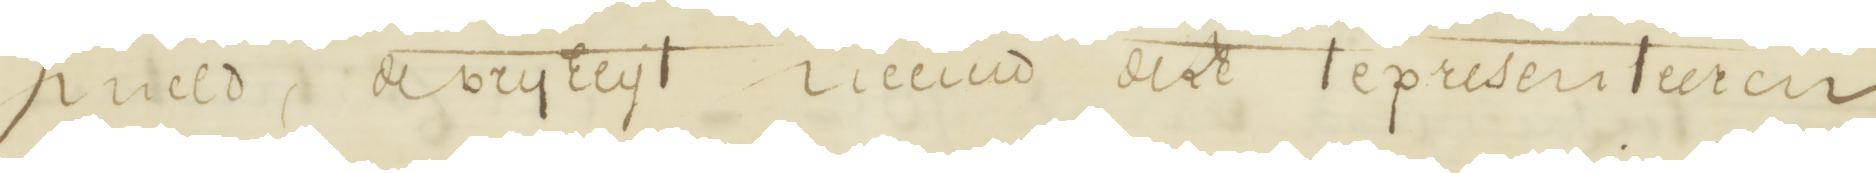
meld de vrijheijt neemd deze te presenteeren
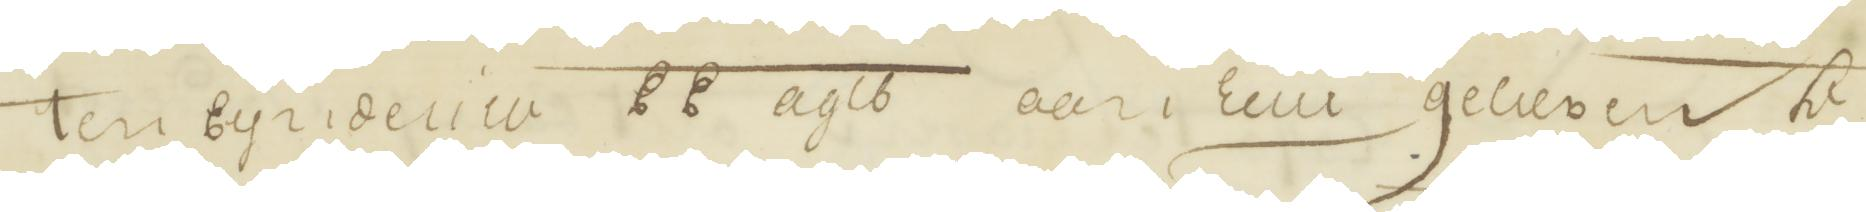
ten eijnde uw EE agtb aan hem gelieven te
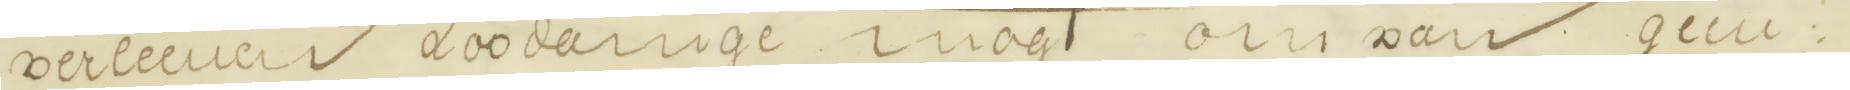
verleenen zoodanige magt om van gem:
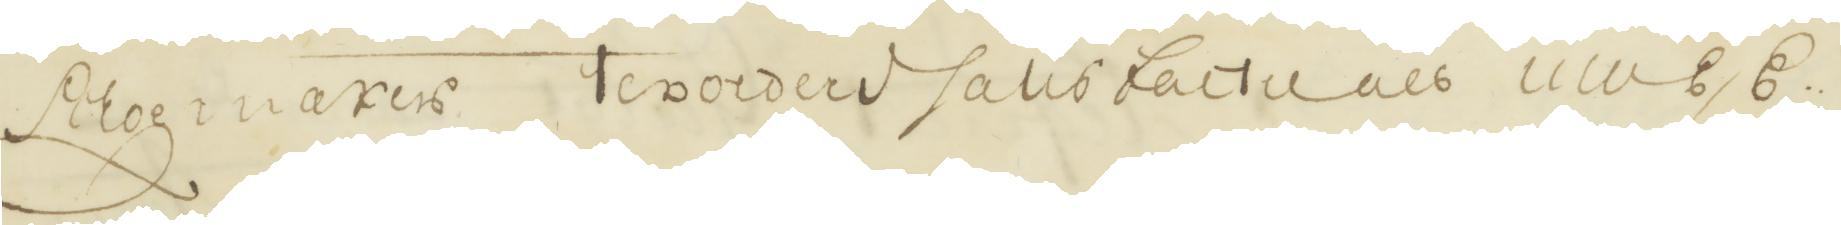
Schoemakers te vordere satisfactie als uw EE:
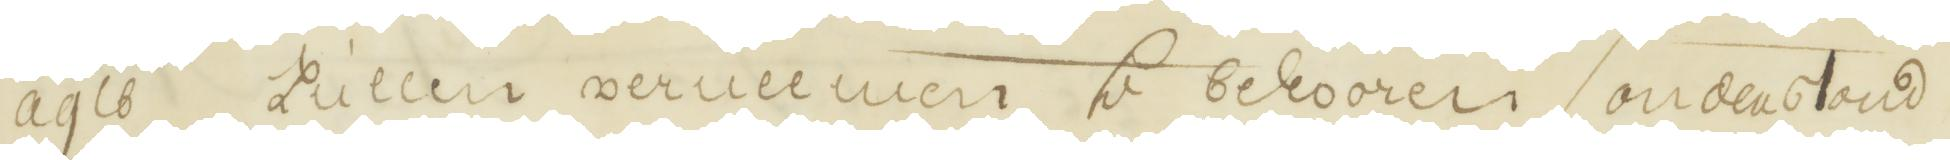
agtb zullen verneemen te behooren /onderstond/
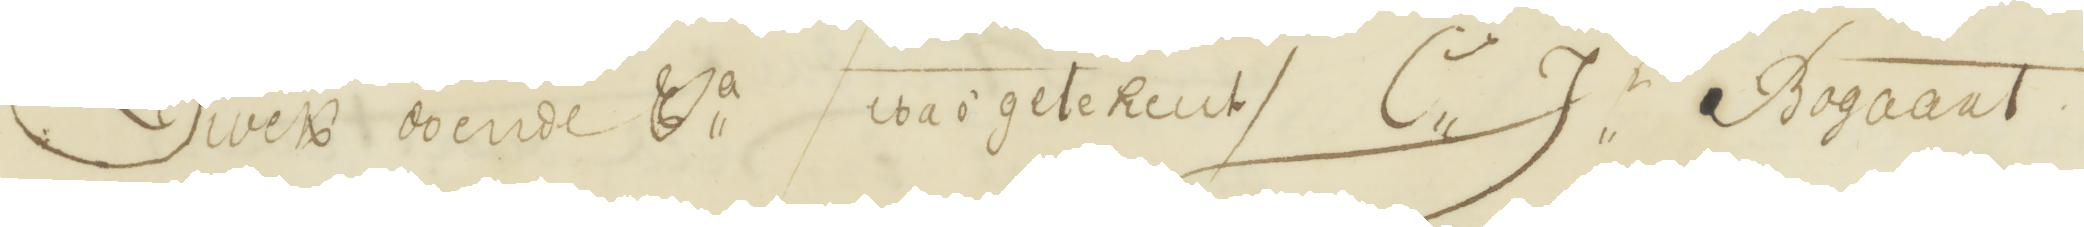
Twelk doende &„a /was getekent:/ C„s J„r Bogaart.
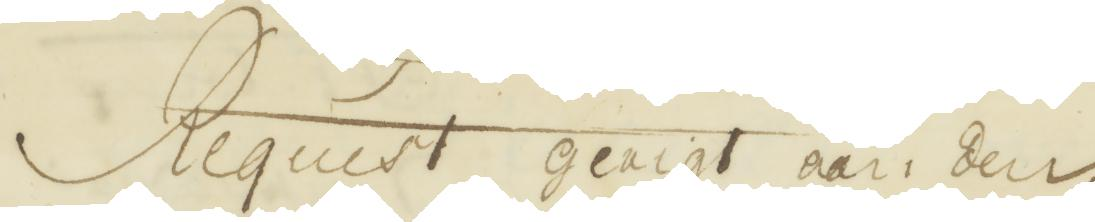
Request gerigt aan den
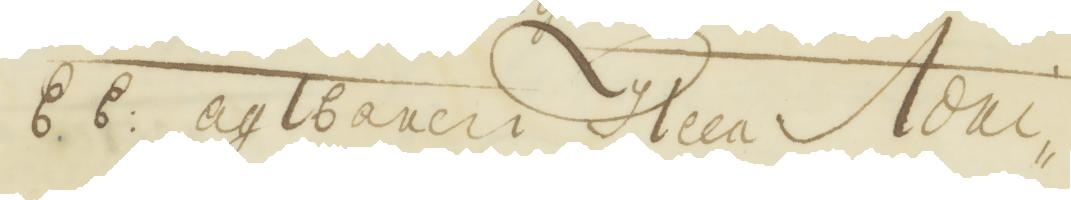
E. E: agtbaren Heer Adri„
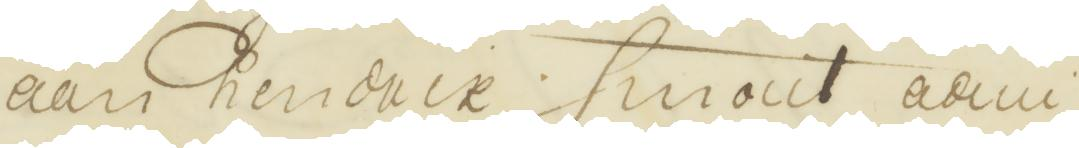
aan hendrik smout admi
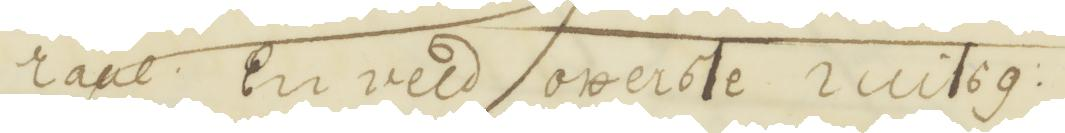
raal; En veld overste mitsg:
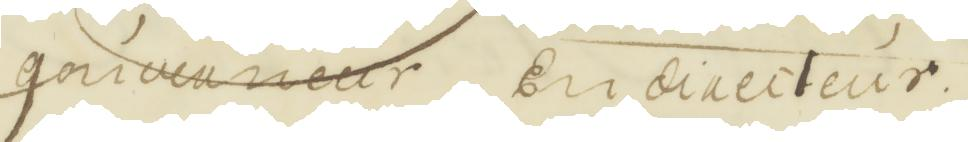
gouverneur En directeur.
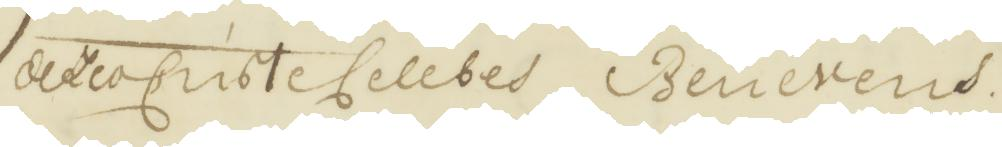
dezer Custe celebes, Benevens.
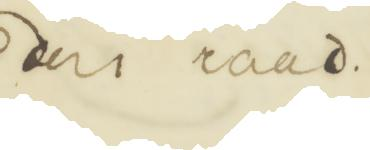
den raad.
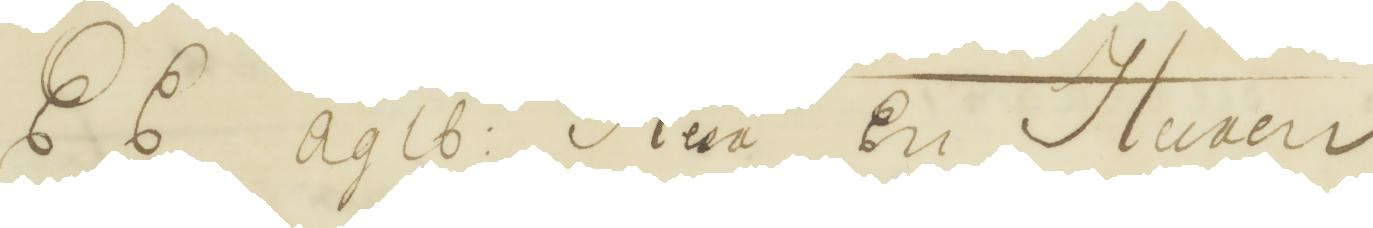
E E agtb: Heer en Heeren.
